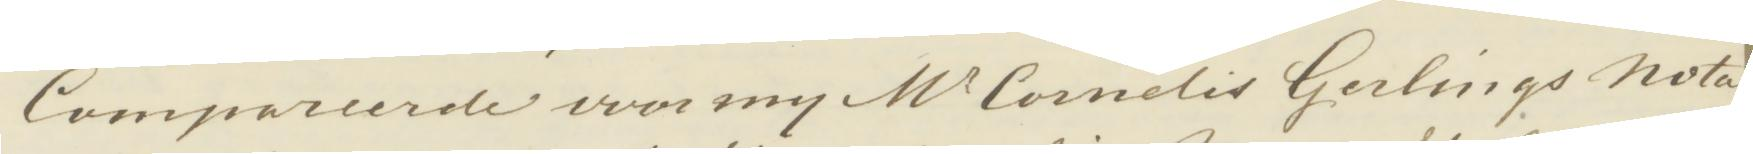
Compareerde voor my Mr Cornelis Gerlings Nota
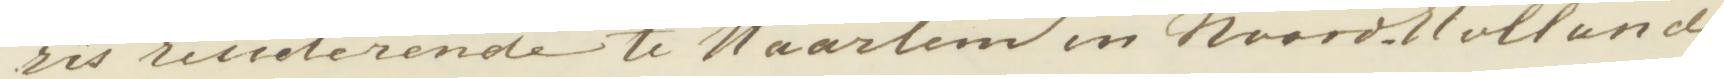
ris residerende te Haarlem in Noord-Holland
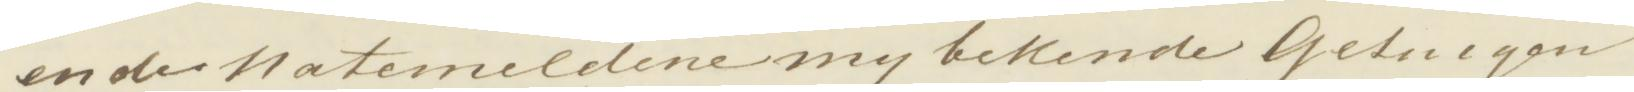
en de Natemeldene my bekende Getuigen
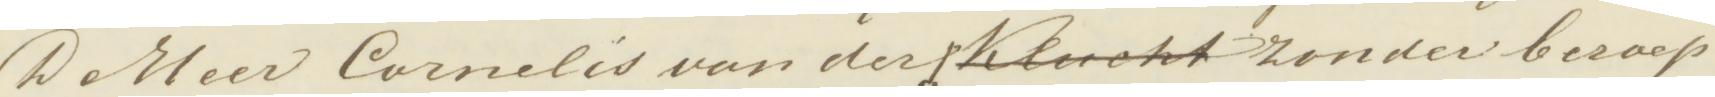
De Heer Cornelis van der | Klucht zonder beroep
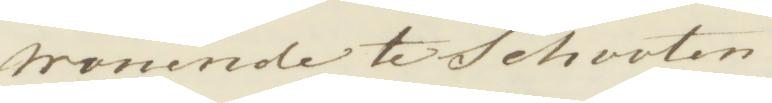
wonende te Schooten
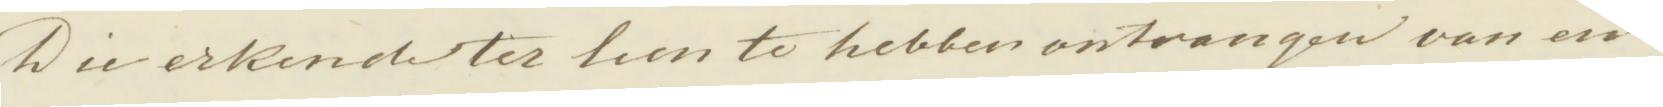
Die erkende ter leen te hebben ontvangen van en
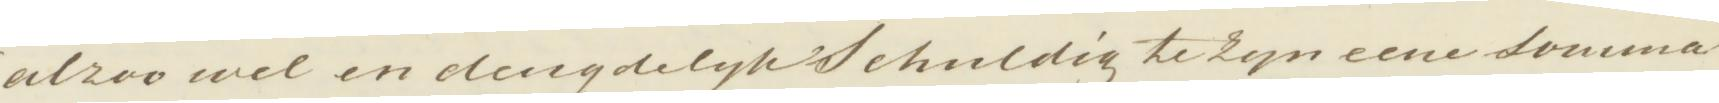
alzoo wel en deugdelyk schuldig te zyn eene somma
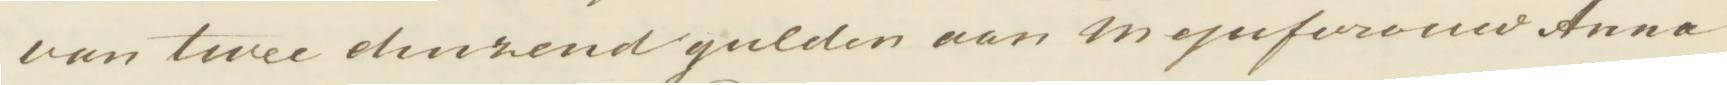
van twee duizend gulden aan Mejufvrouw Anna
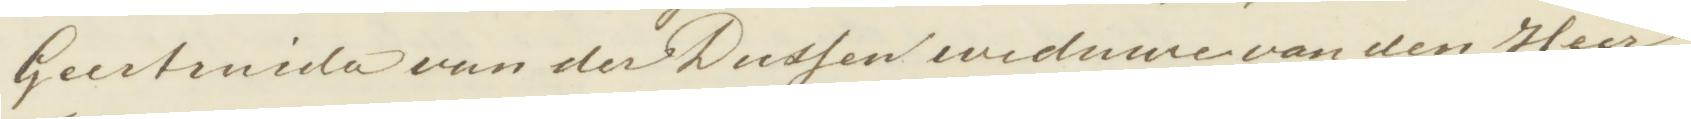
Geertruida van der Dussen weduwe van den Heer
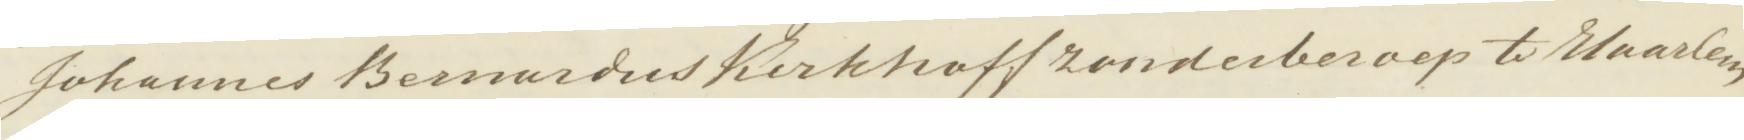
Johannes Bernardus Kerkhoff zonder beroep te Haarlem
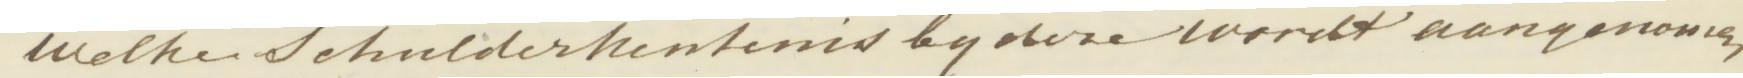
welke Schulderkentenis by deze wordt aangenomen
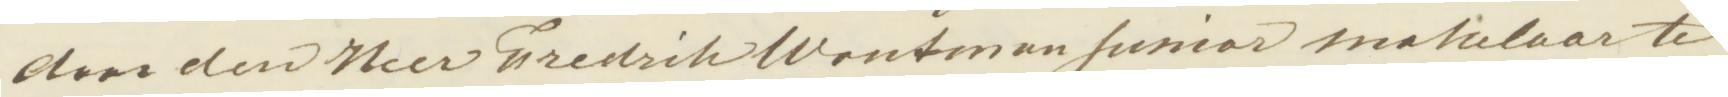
door den Heer Fredrik Woutman Junior makelaar te
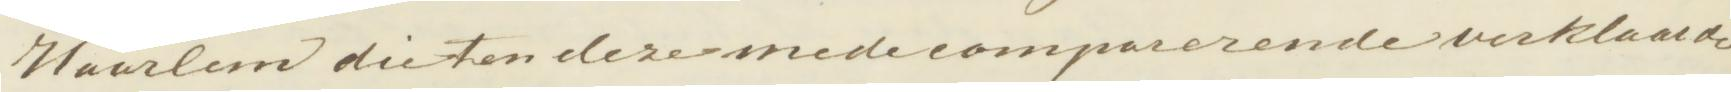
Haarlem die ten deze mede comparerende verklaarde
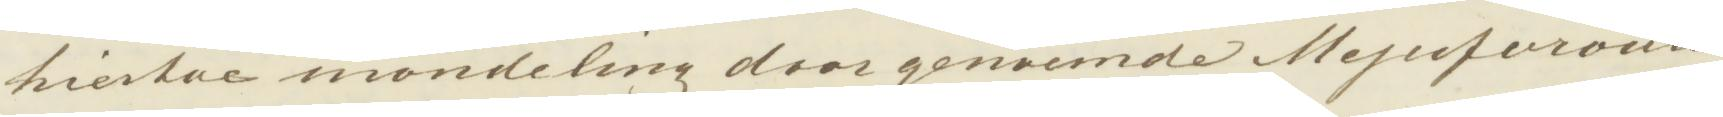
hiertoe mondeling door genoemde Mejufvrouw
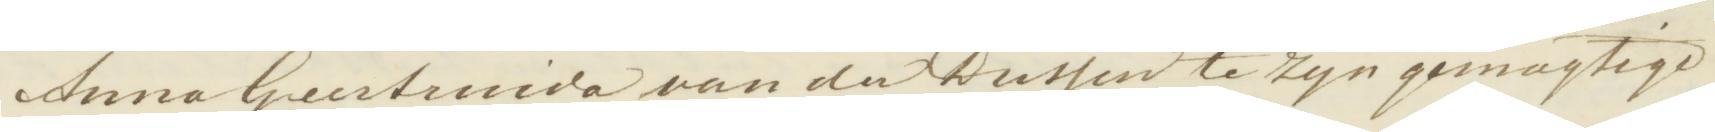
Anna Geertruida van der Dussen te zyn gemagtigd
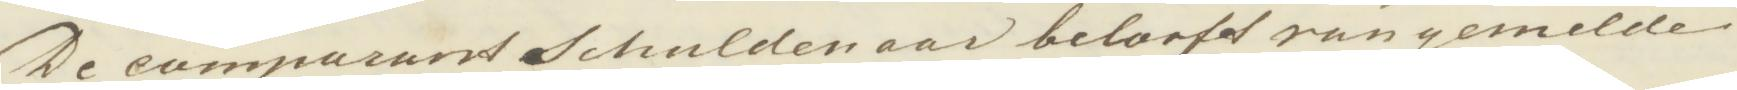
De comparant schuldenaar belooft van gemelde
